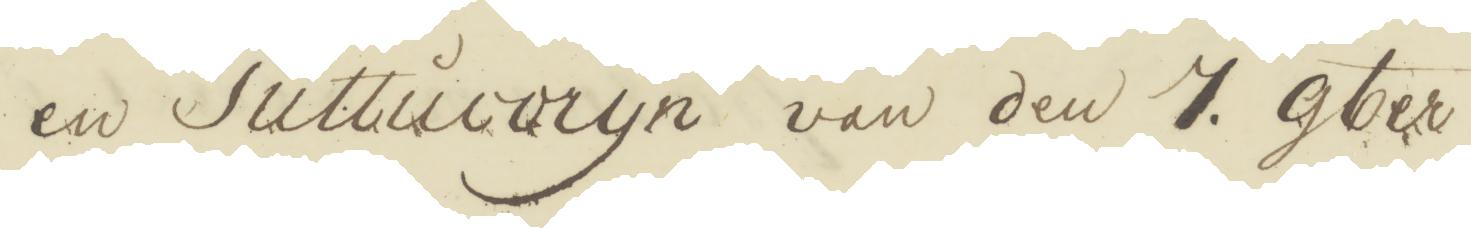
en Tuttucorijn van den 7. 9ber
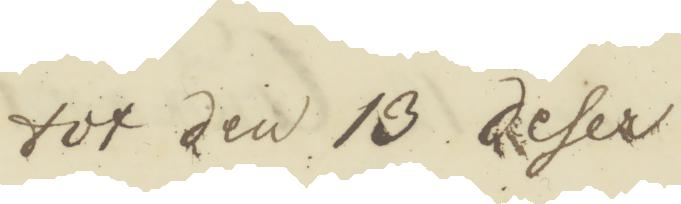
tot den 13 deser
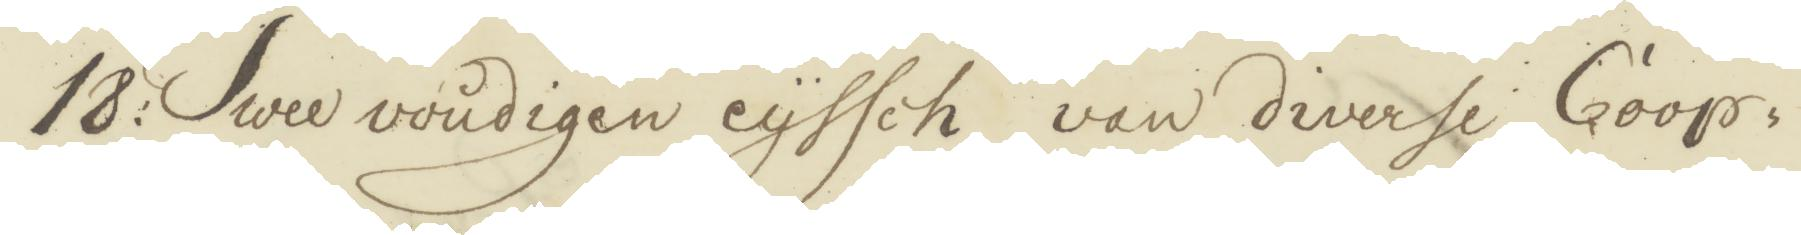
18: Twee voudigen eijssch van diverse Coop„
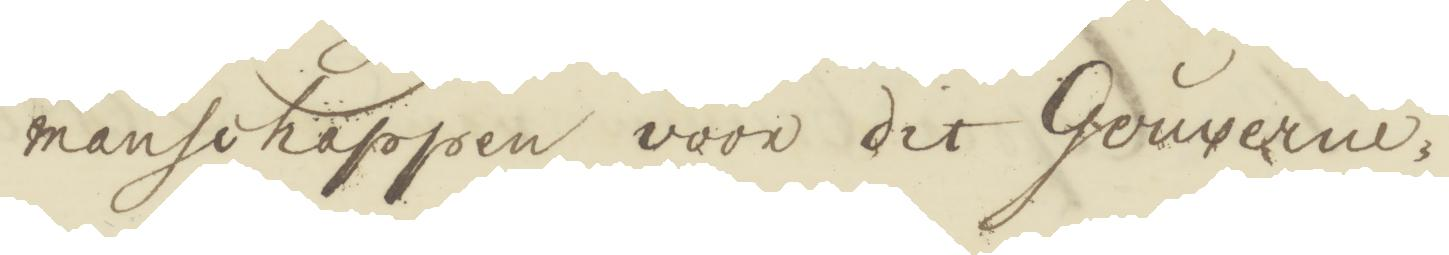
manschappen voor dit Gouverne„
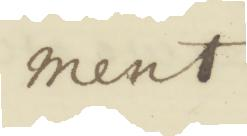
ment
